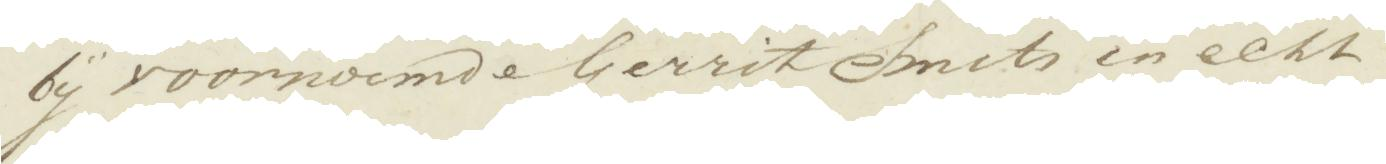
bij voornoemde Gerrit Smits in acht
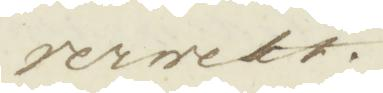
verwekt.
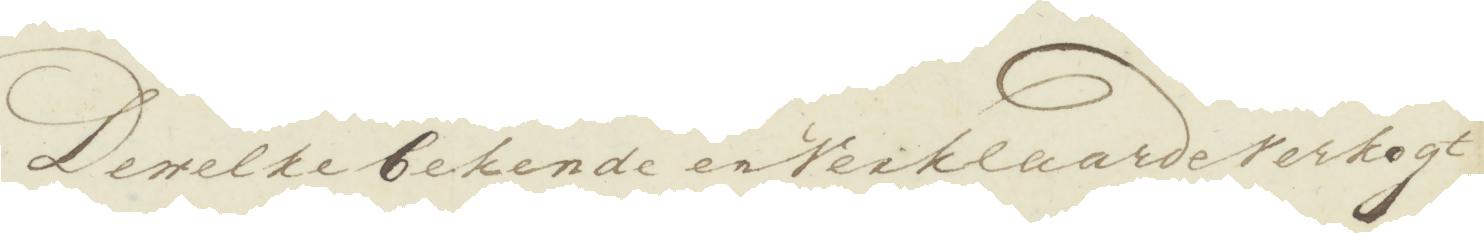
Dewelke bekende en Verklaarde verkogt
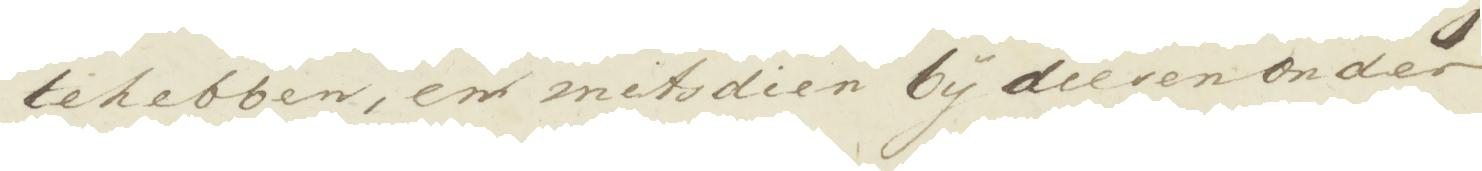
te hebben, en mitsdien bij deesen onder
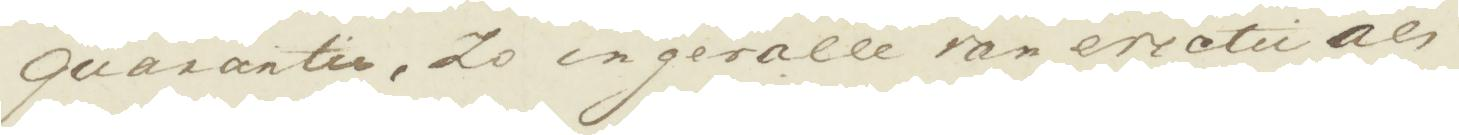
guarantie, zo ingevalle van evictie als
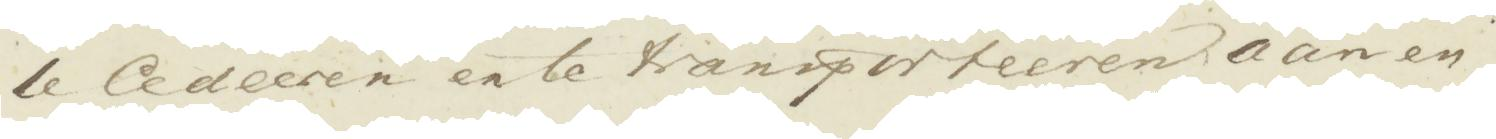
te cedeeren en te transporteeren aan en
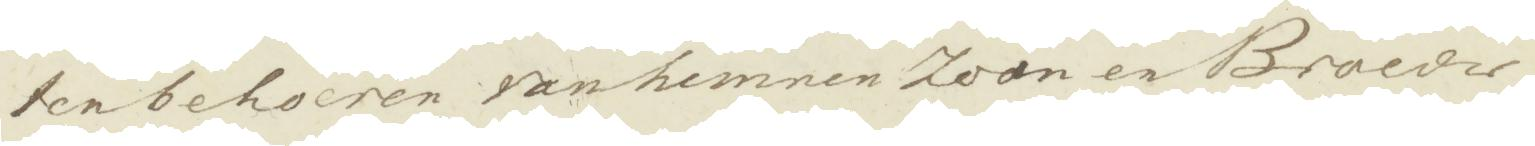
ten behoeven van hunnen zoon en Broeder
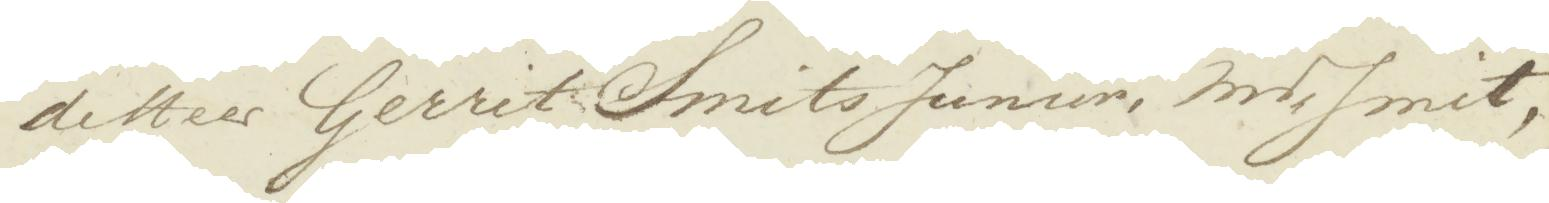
de Heer Gerrit Smits Junior, m„r Smit,
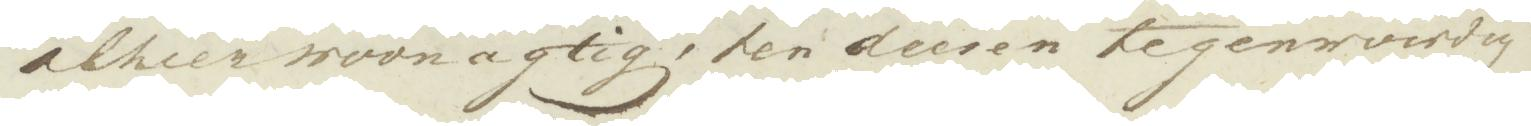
alhier woonagtig, ten deesen tegenwoordig
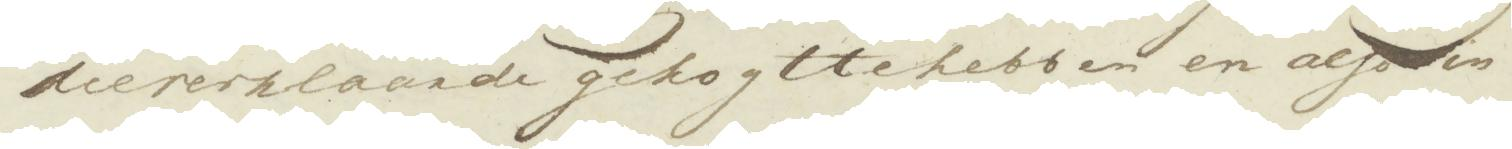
die verklaarde gekogt te hebben en also in
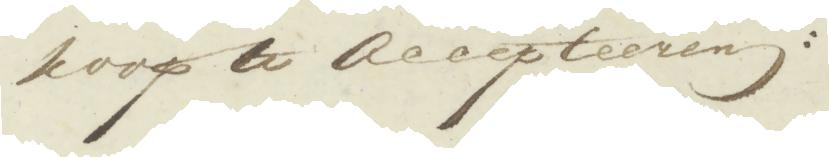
koop te accepteeren:
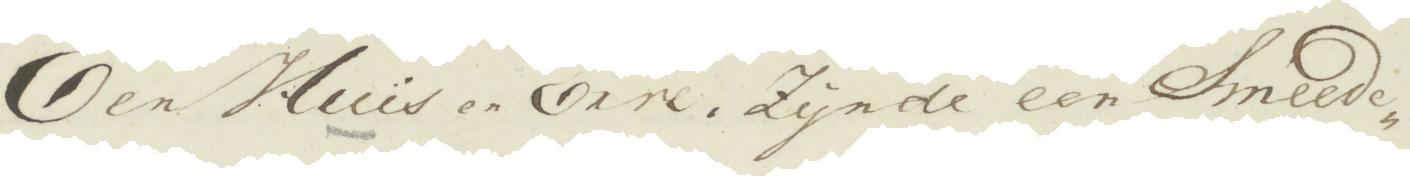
Een Huis en Erve, zijnde een Smeede„
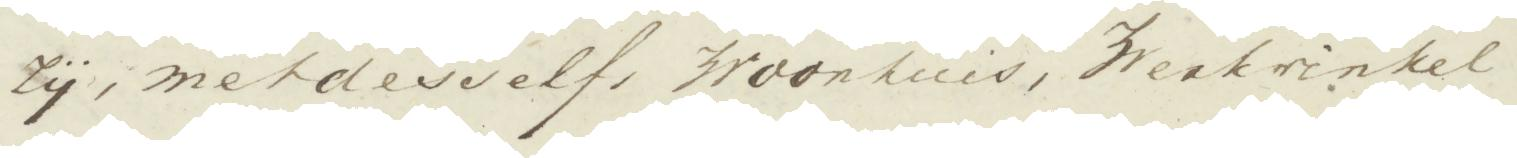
rij, met desselfs woon huis, Werkwinkel
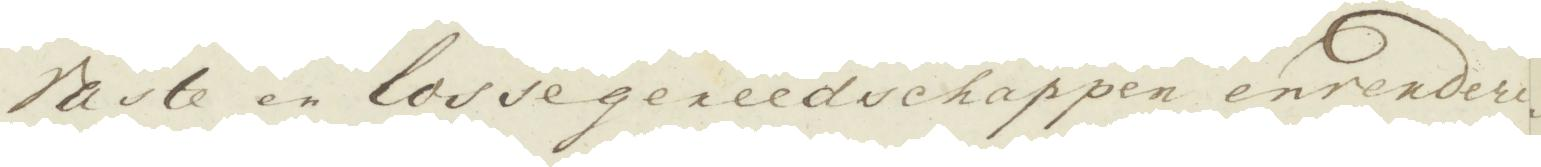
Vaste en losse gereedschappen en verdere
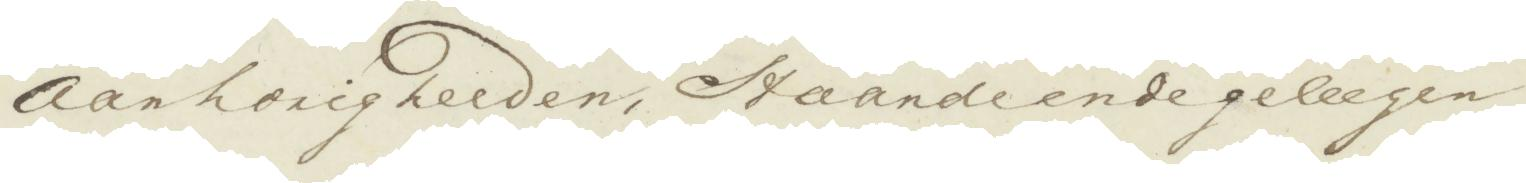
aanhorigheeden, staande ende geleegen
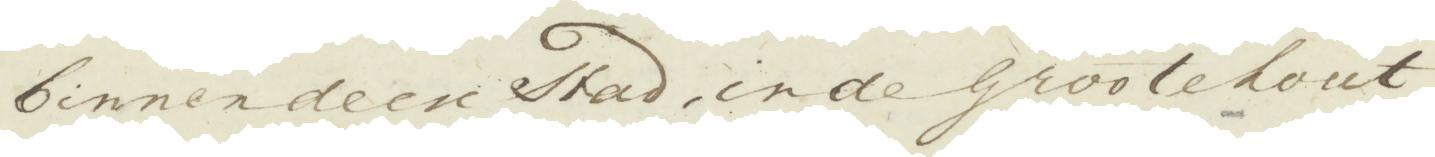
binnen deese stad, in de groote hout
